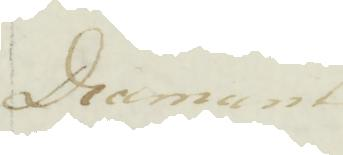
Diamant
